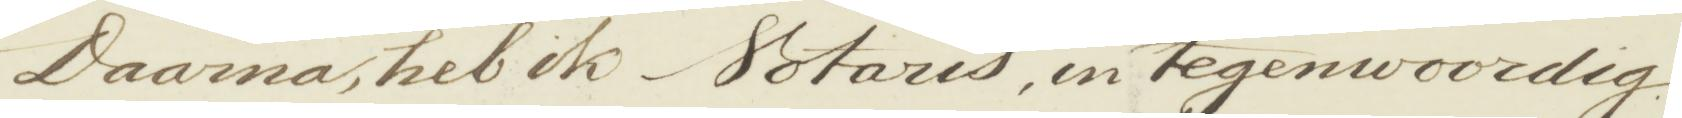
Daarna, heb ik Notaris, in tegenwoordig.
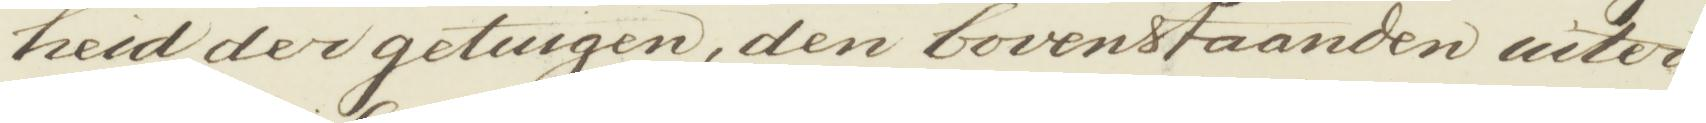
heid der getuigen, den bovenstaanden uiter
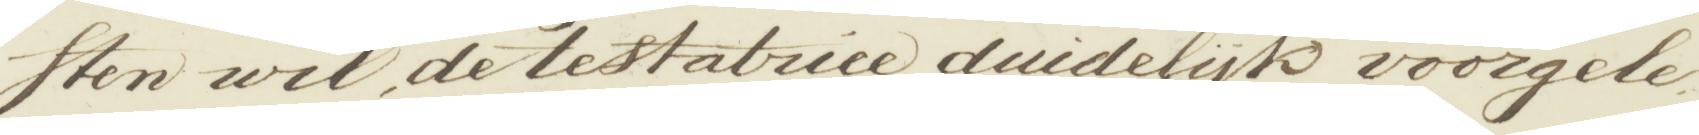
sten wil, de testatrice duidelijk voorgele,.
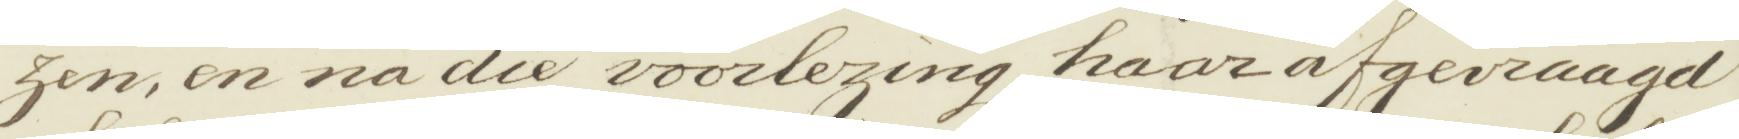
zen, en na die voorlezing haar afgevraagd
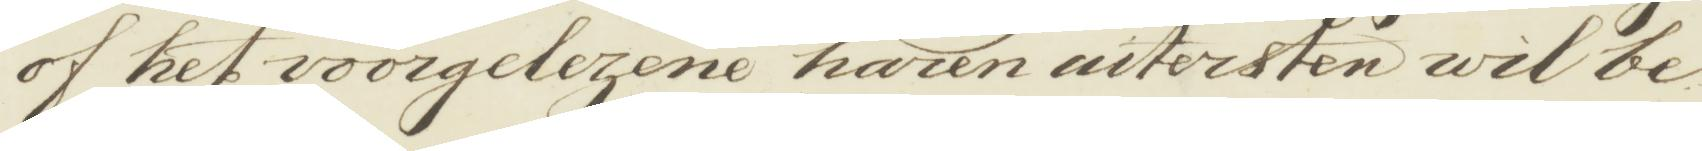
of het voorgelezene haren uitersten wil be.
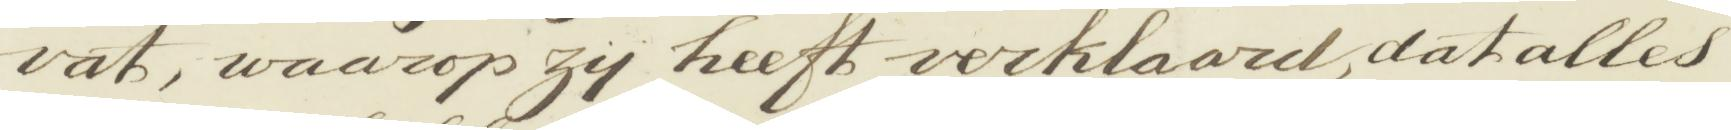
vat, waarop zij heeft verklaard, dat alles
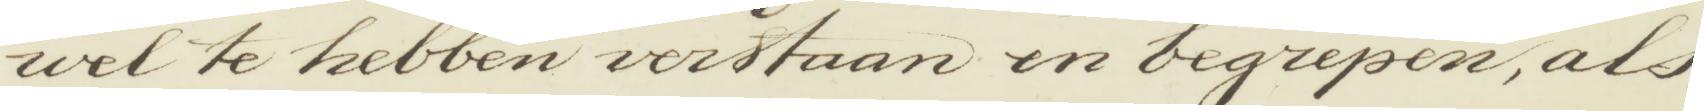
wel te hebben verstaan en begrepen, als
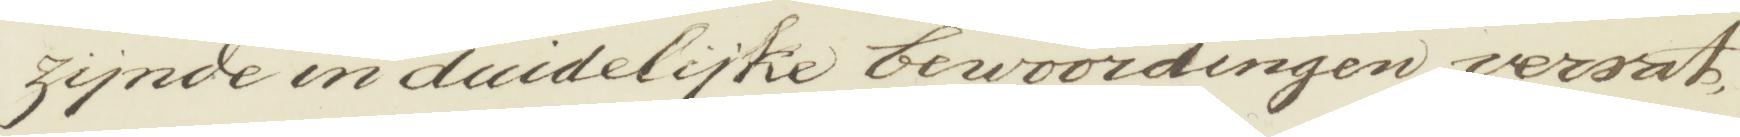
zijnde in duidelijke bewoordingen vervat,
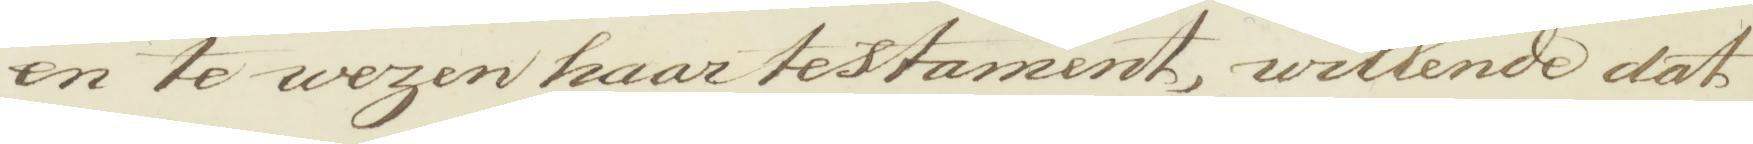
en te wezen haar testament, willende dat
